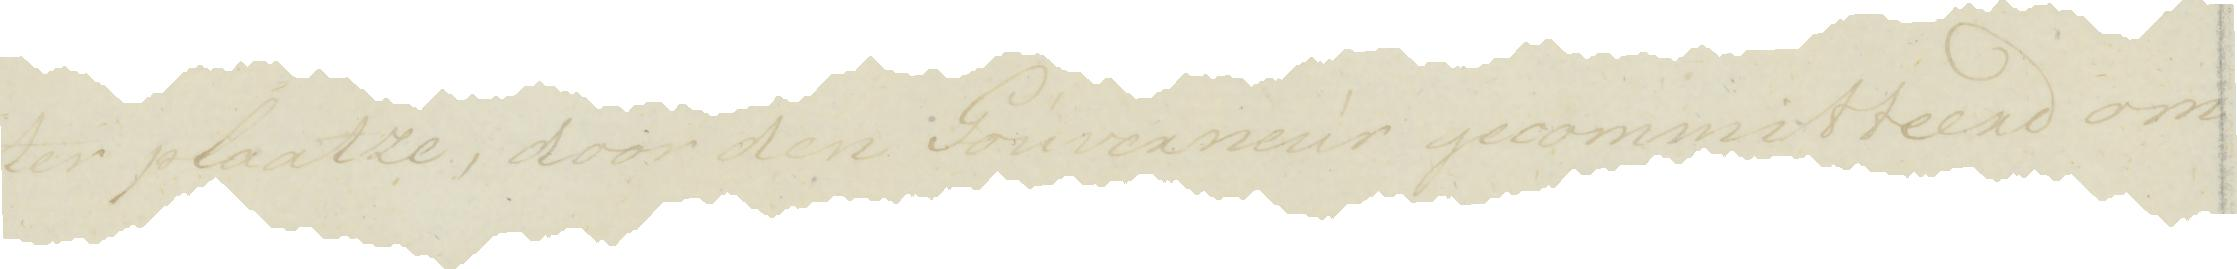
hier ter plaatze, door den Gouverneur gecommitteerd om
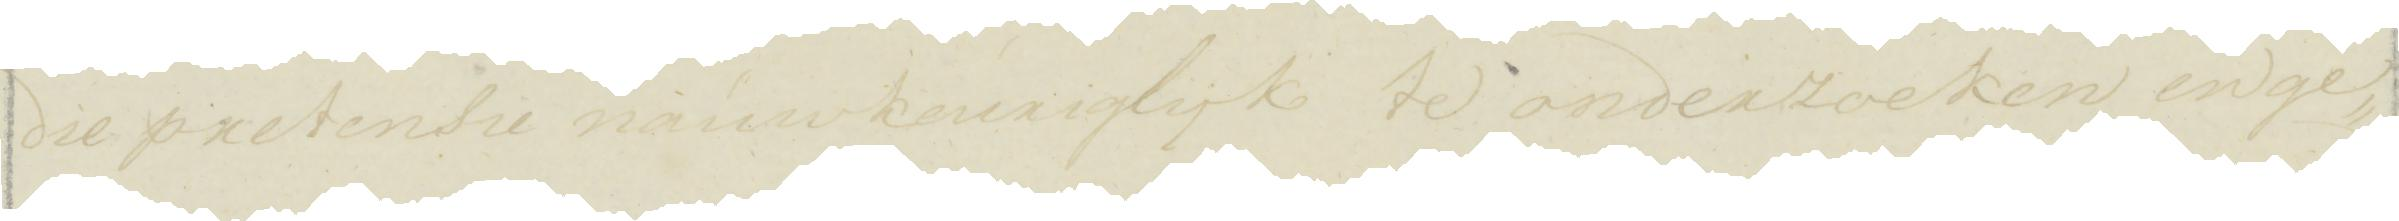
die pretensie nauwkeuriglijk te onderzoeken en ge„
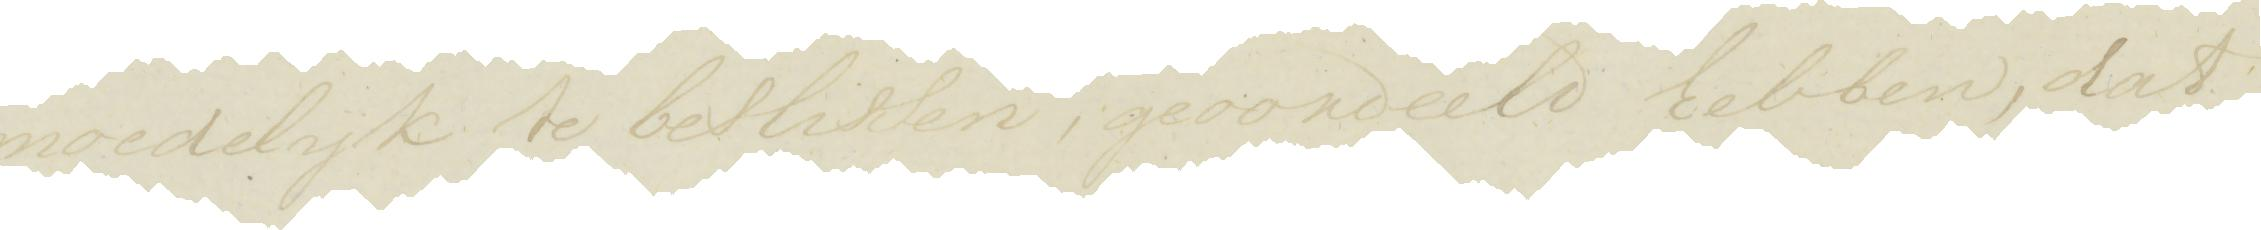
moedelijk te beslissen, geoordeeld hebben, dat
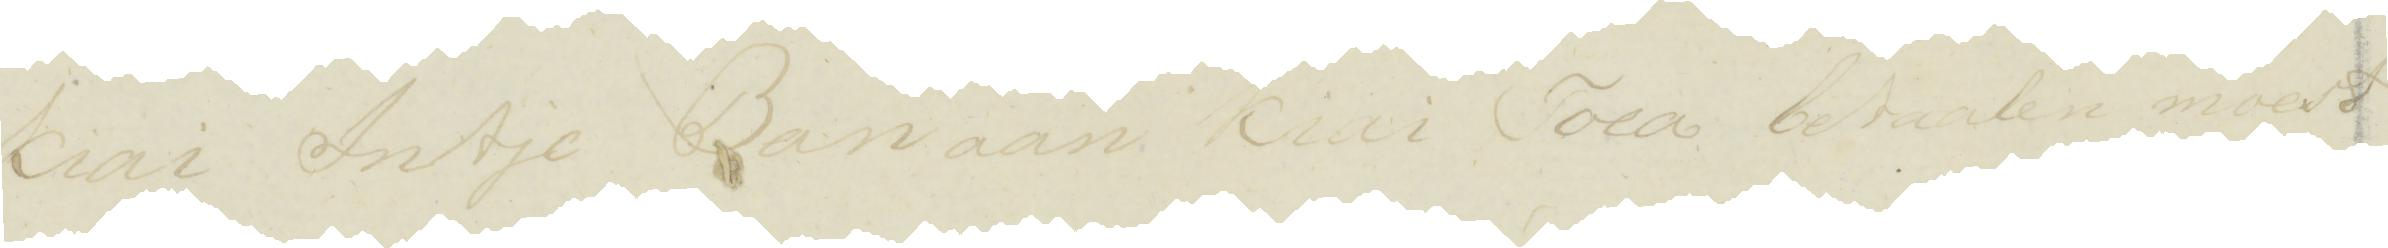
Kiai Intje Ban aan kiai Toea betaalen moest
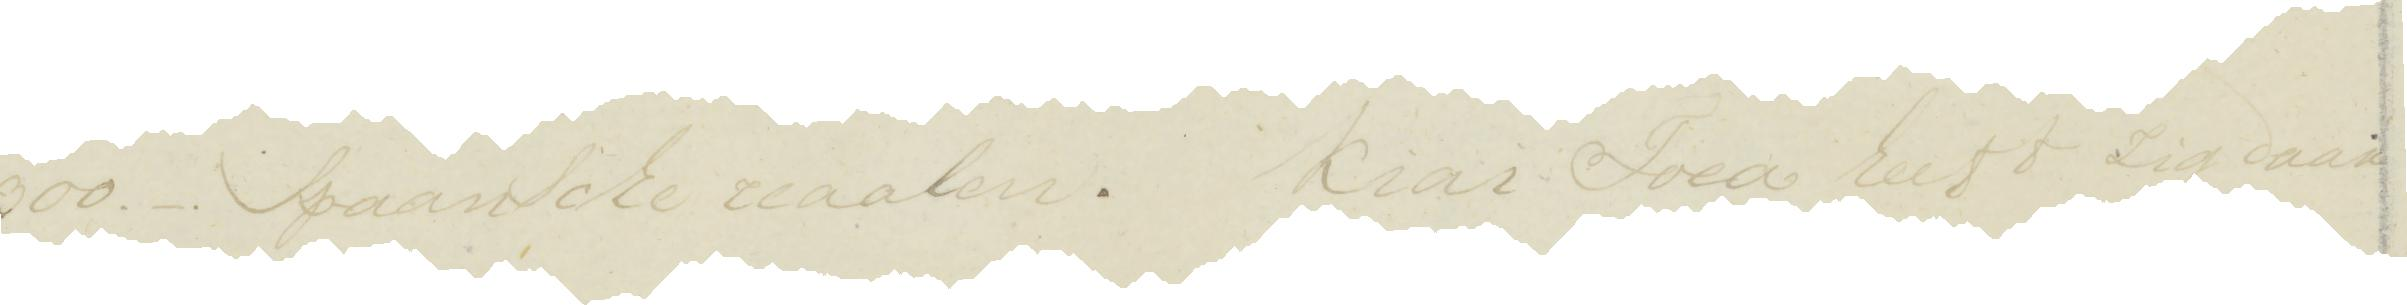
300._. spaansche reaalen. Kiai Toea heeft zig daar
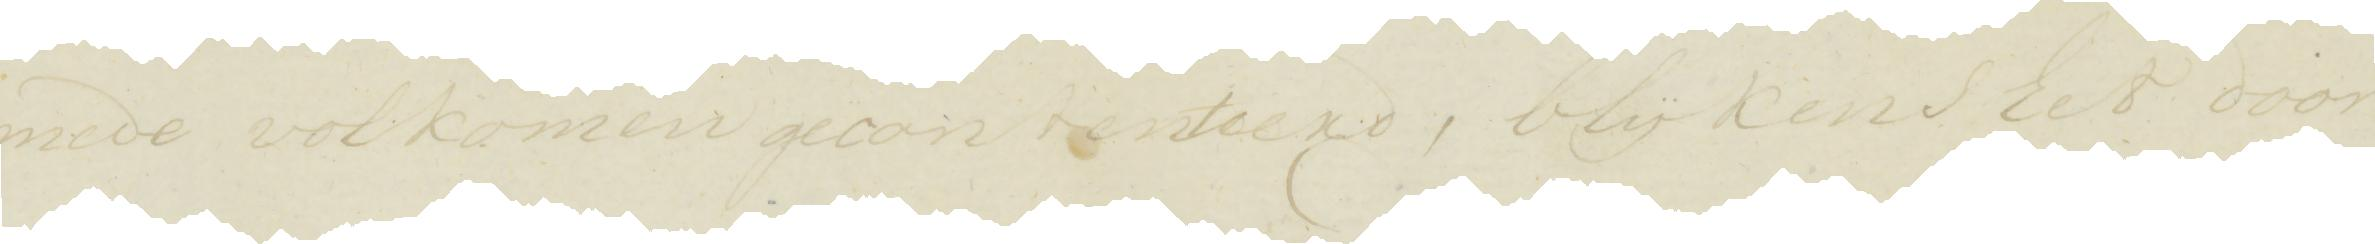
mede volkomen gecontenteerd, blijkens het door
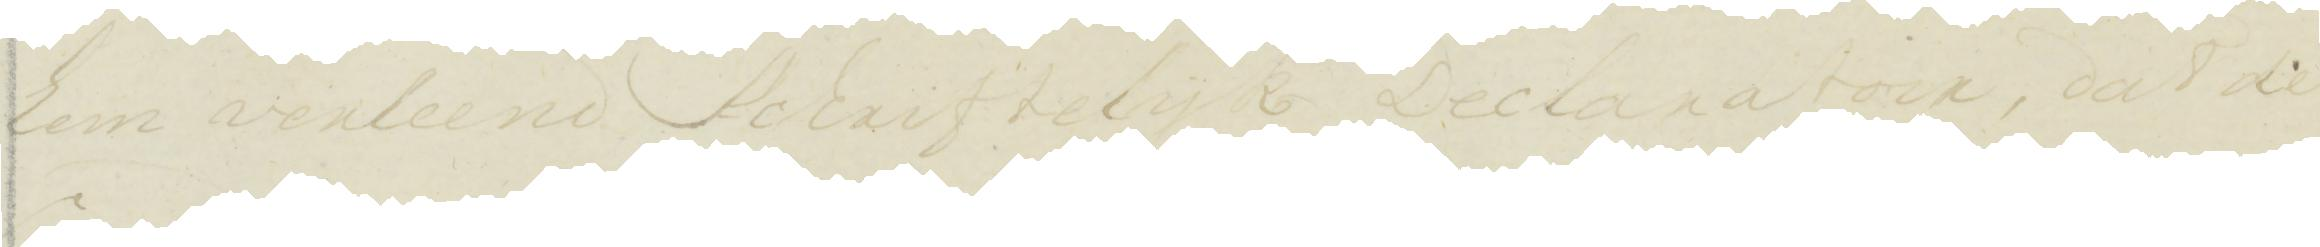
hem verleend schriftelijk Declaratoir, dat de
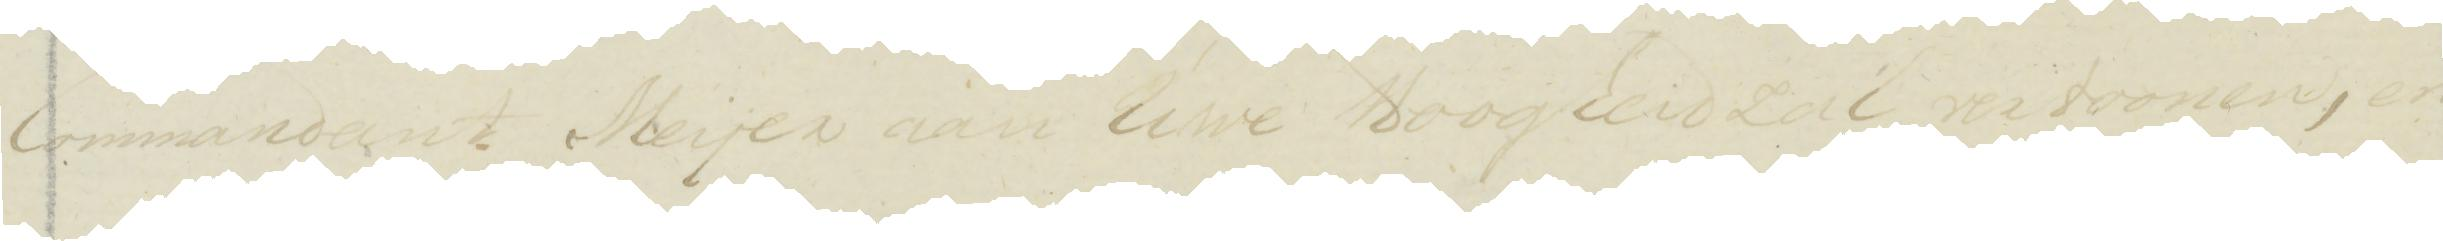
Commandant Meijer aan Uwe Hoogheed zal vertoonen, en
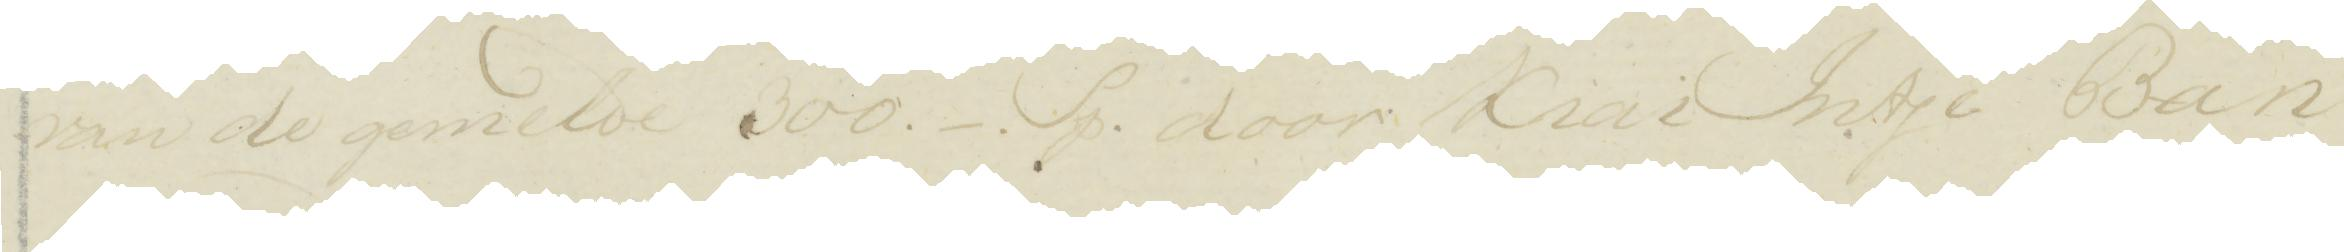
van de gemelde 300._. sp. door Kiai Intje Ban
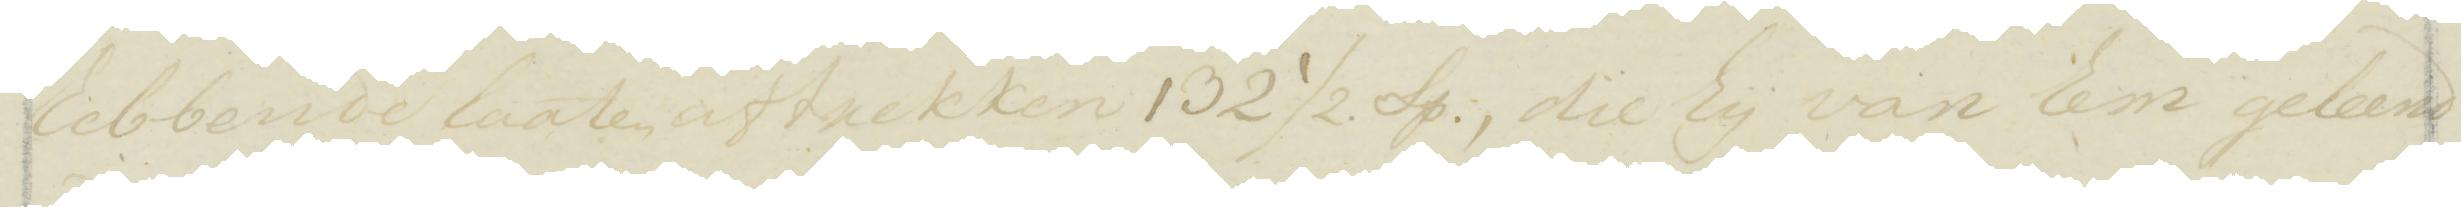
hebbende laaten aftrekken 132½ sp., die hij van hem geleend
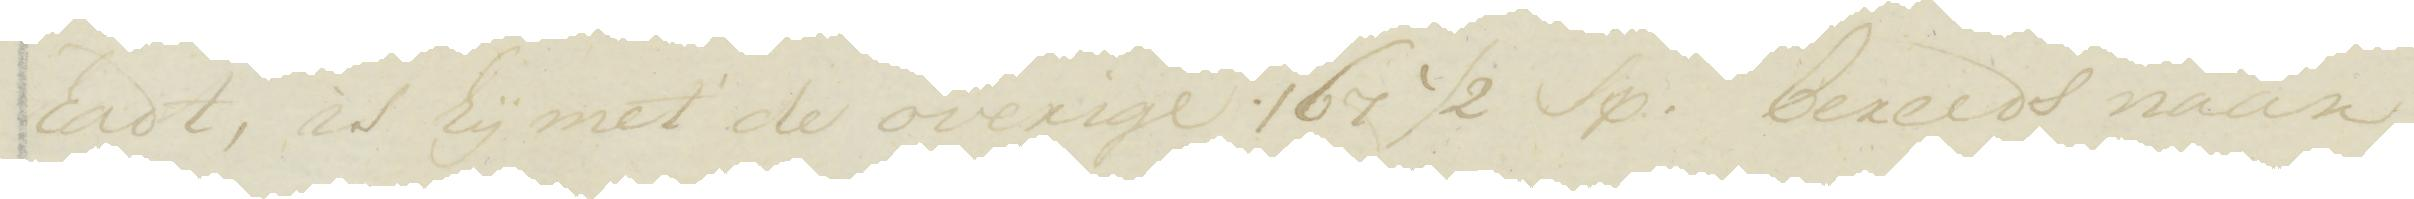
hadt, is hij met de overige 167½ sp. bereeds naar
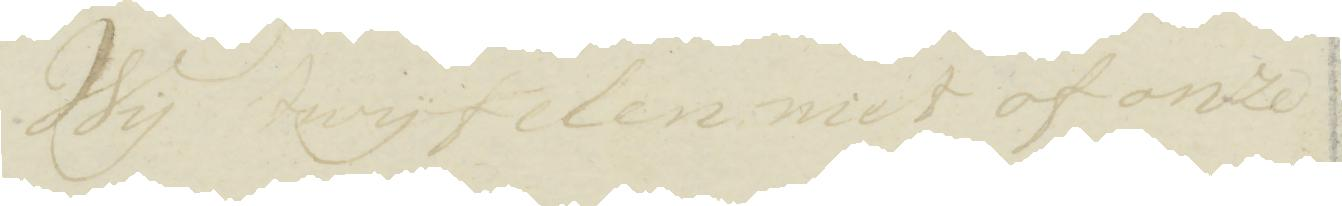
Wij twijfelen niet of onze
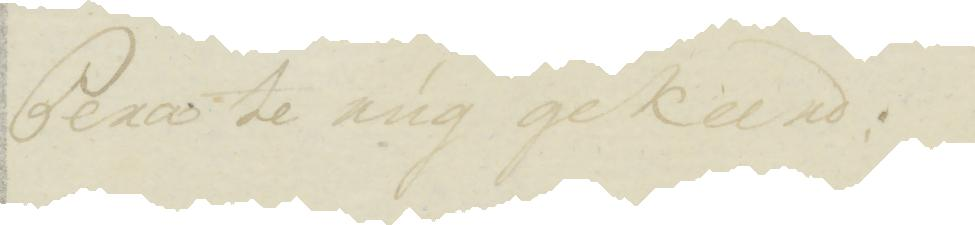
Pera te rug gekeerd.
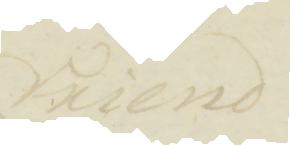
Vriend
